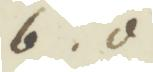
6. d
